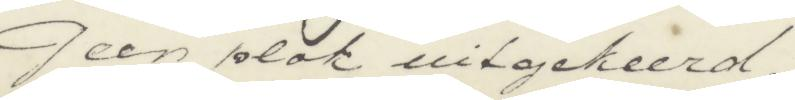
Geen plok uitgekeerd.
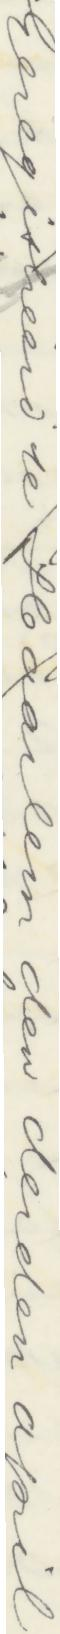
Geregistreerd te Haarlem den derden april
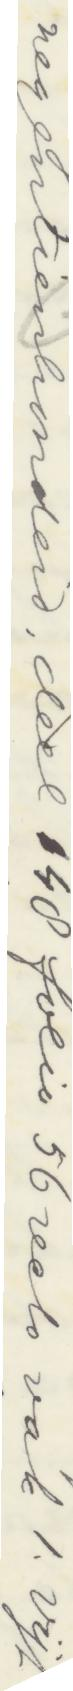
negentienhonderd, deel 148 folio 56 recto vak 1. vijf
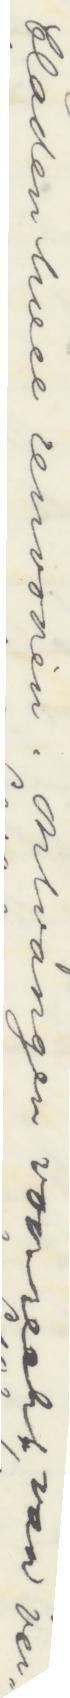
bladen twee renvooien. ontvangen voorrecht van ver„
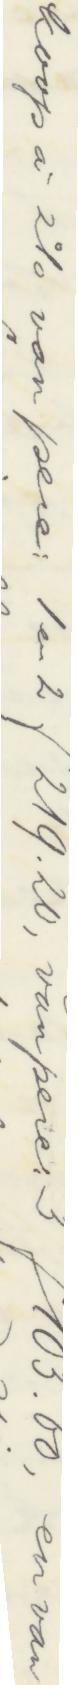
koop à 2% van perc: 1 en 2 ƒ 219.20, van perc: 3 ƒ103.60, en van
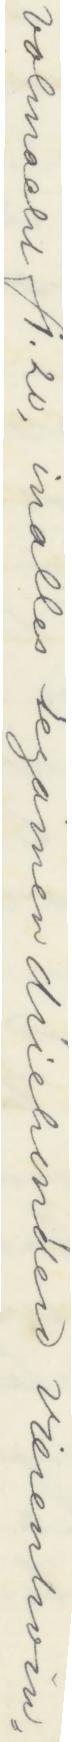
volmacht ƒ1.20, in alles tezamen driehonderd vierentwin„
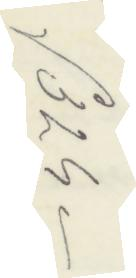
ƒ324—
